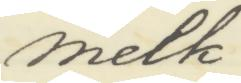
melk
